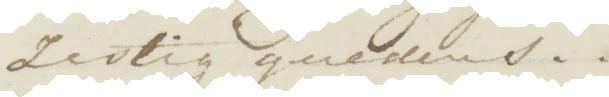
Zestig guldens.
